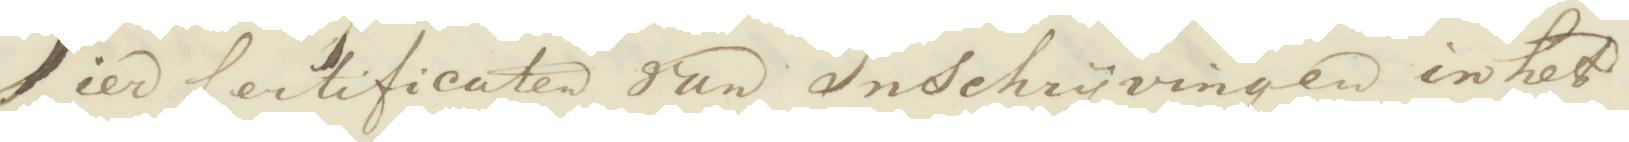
Vier Certificaten van Inschrijvingen in het
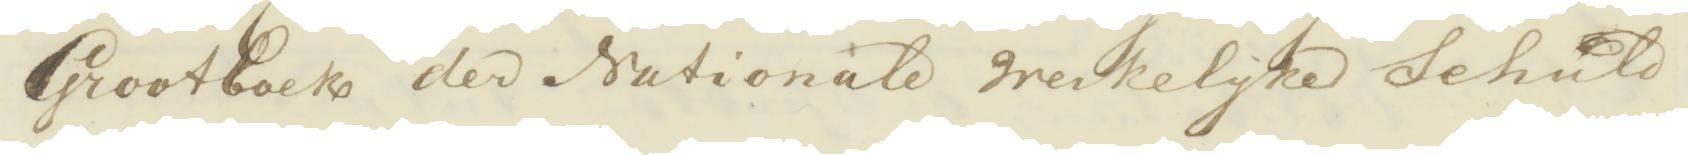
Grootboek der Nationale werkelijke schuld
